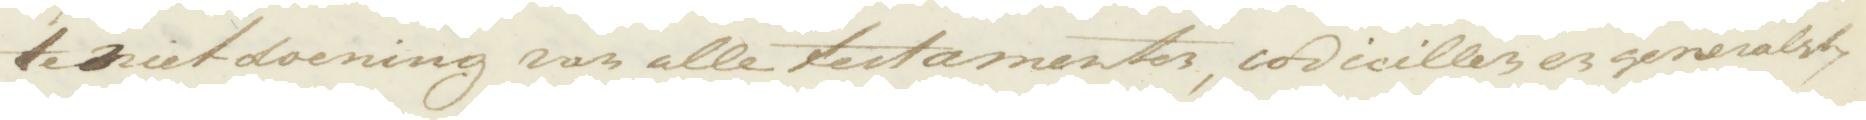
te niet doening van alle testamenten, codicillen en generalyk
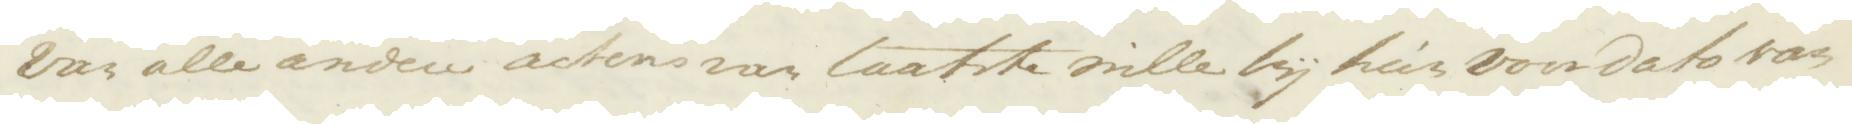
van alle andere actens van laatste wille by hun voor dato van
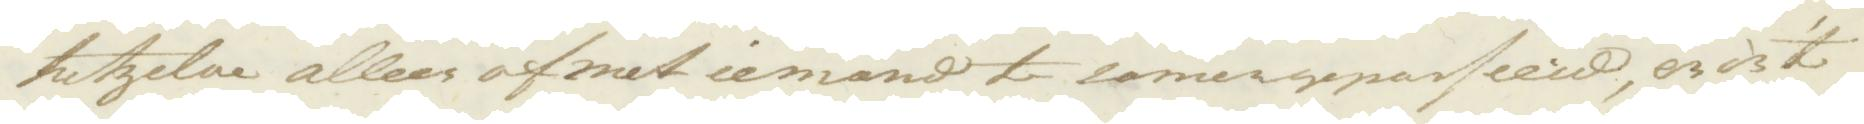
hetzelve alleen of met iemand te zamen gepasseerd, en in 't
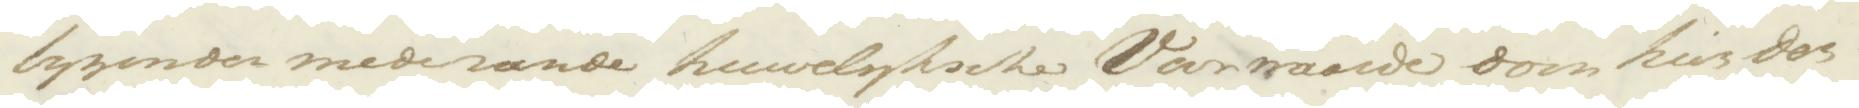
byzonder mede vande huwelyksche Voorwaarde door hun den
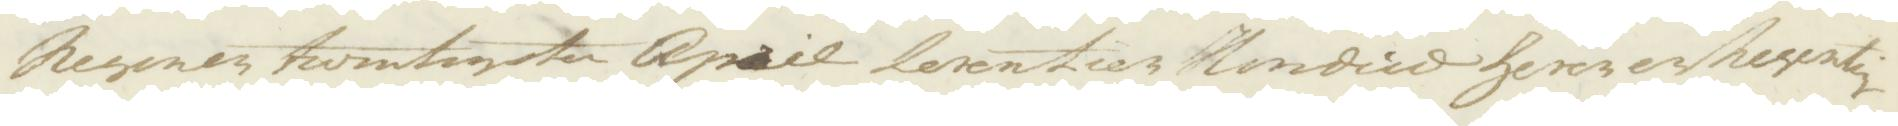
Negenen twintigsten April Zeventien Honderd Zeven en negentig
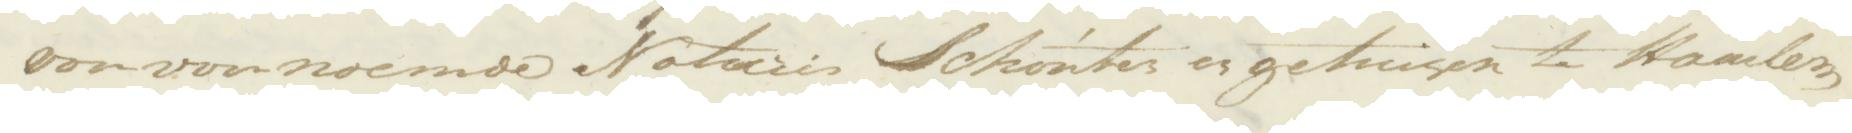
voor voornoemde Notaris Schouten en getuigen te Haarlem
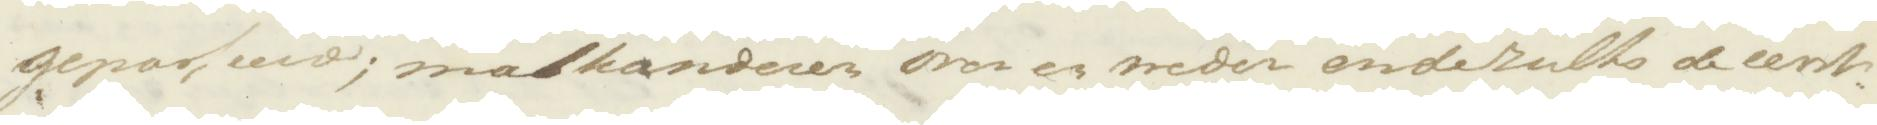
gepasseerd; malkanderen over en weder ende zulks de eerst
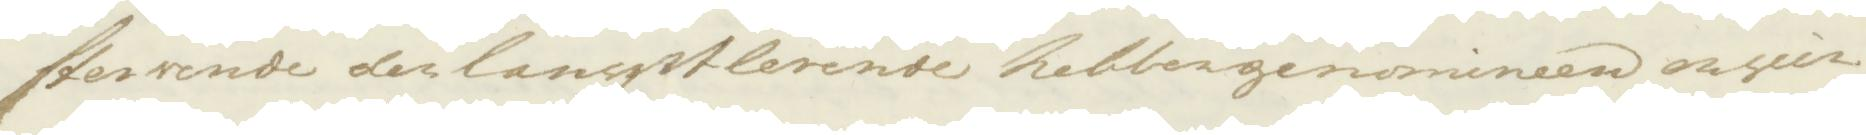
stervende den langstlevente hebben genomineerd en gein
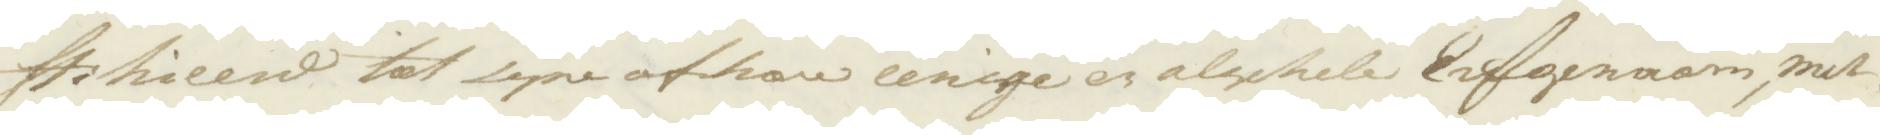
stitueerd tot zyne of hare eenige en algehele Erfgenaam, met
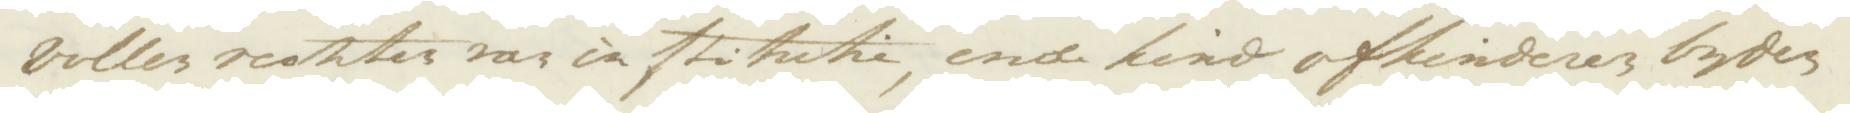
vollen rechten van institutie, ende kind of kinderen by den
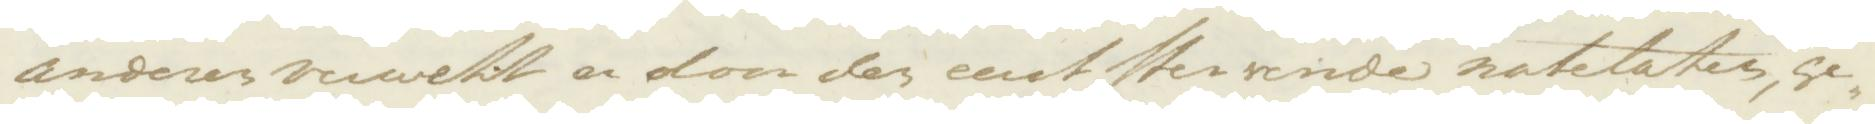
anderen verwekt en door den eerst stervende natelaten, ge„
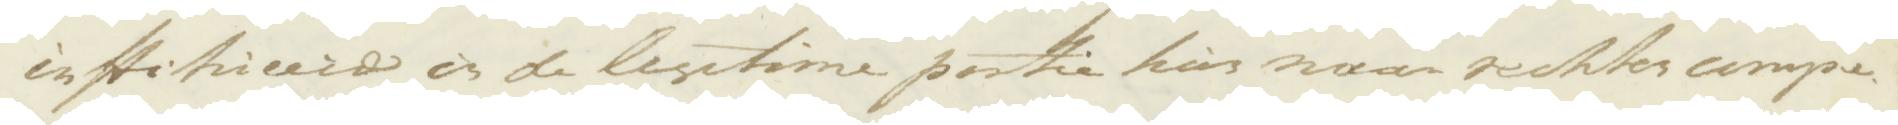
institueerd in de legitime portie hun naar rechten compe„
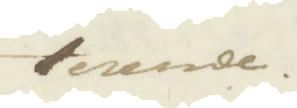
terende.
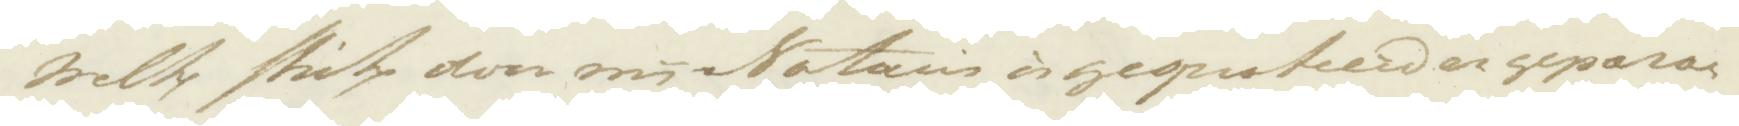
welk stuk door mij Notaris is gepasseerd en gepera
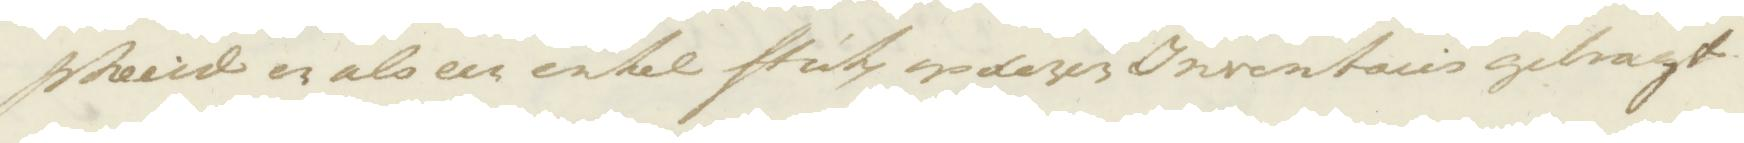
pheerd en als een entel stuk op dezen Inventaris gebragt
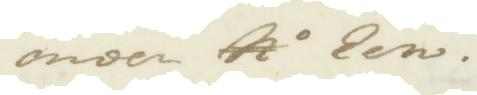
onder No Een.
